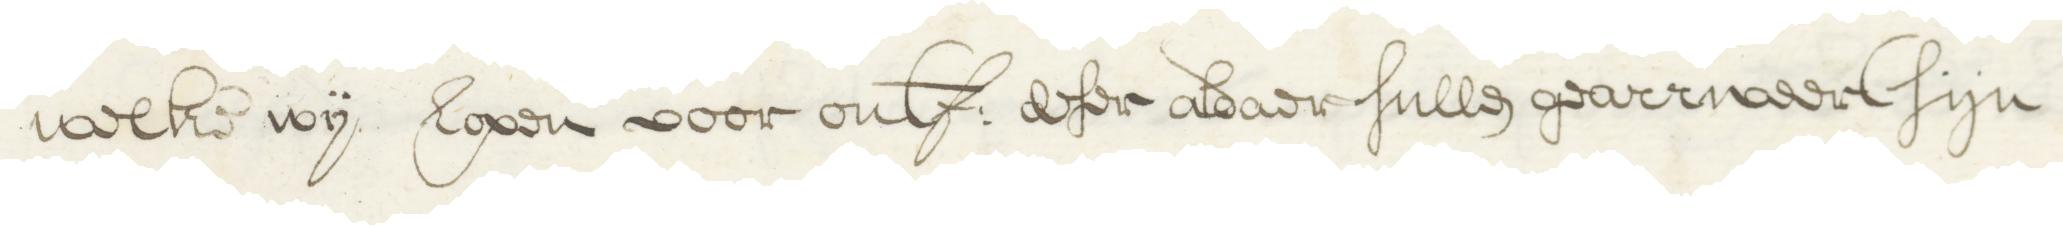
welke wij hopen voor ontf: deser aldaer sullen gearriveert sijn
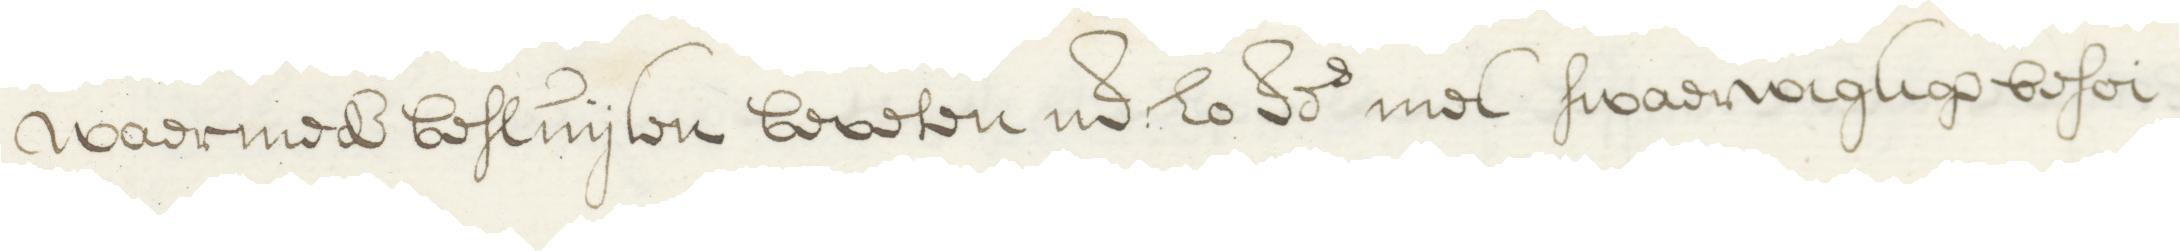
waermede besluijten bevelen uE: ho Eds met swaerwigtige besoi
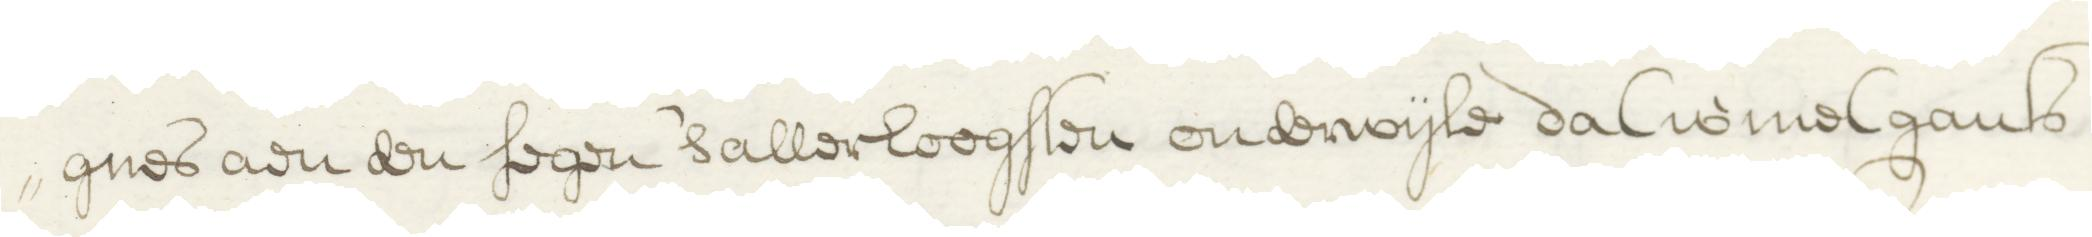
„gnes aen den segen 's allerhoogsten onderwijle dat w' met gants
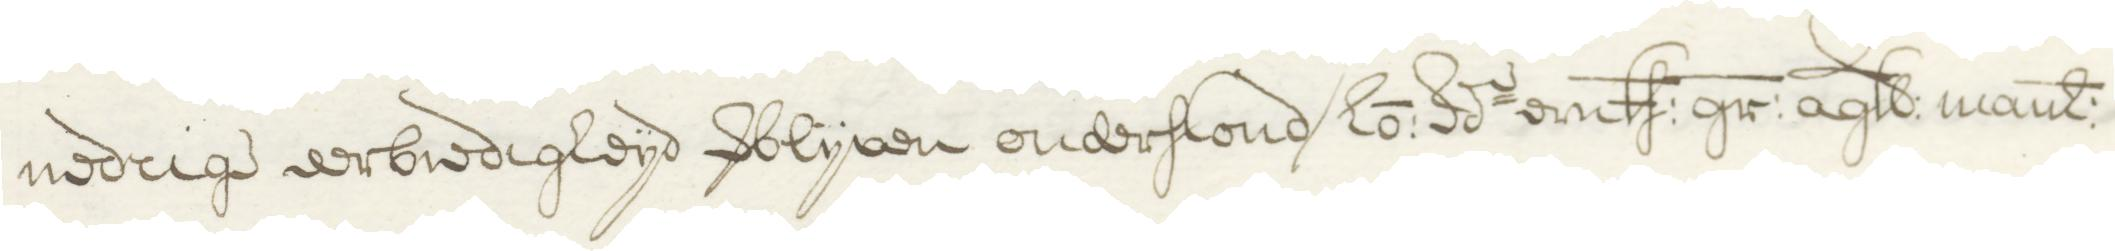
nedrige eerbiedigheijd verblijven onderstond/ho: Ed=e erntf: gr: agtb: manh:
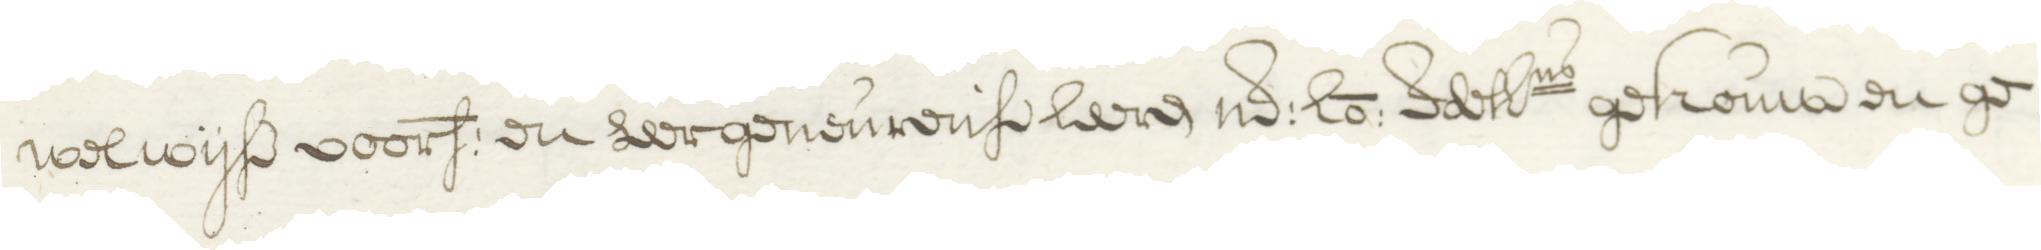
wel wijse voors: en seer geneureuse heeren uE: ho: Edelh=ns getrouw en ge
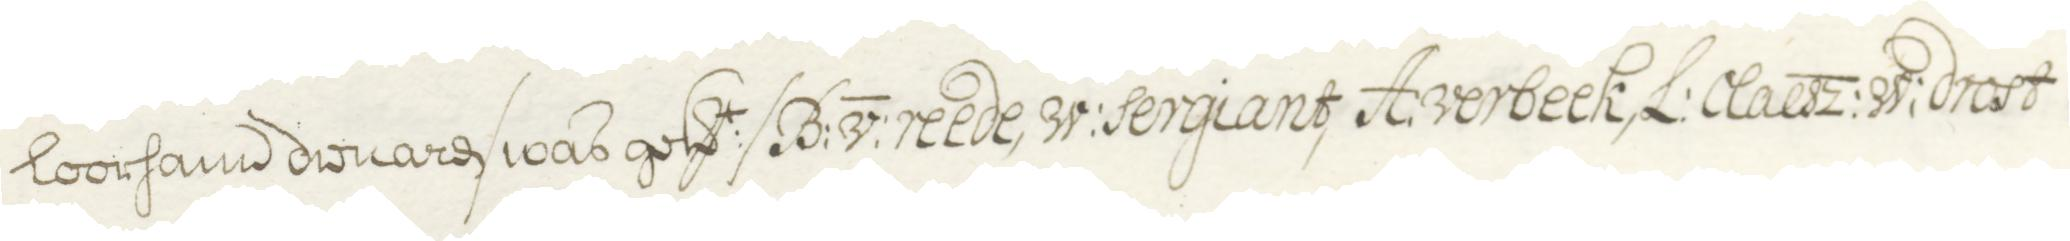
hoorsame dienaren/ was getE:t/ B: v: reede, w: sergiant, A: verbeek, L: claesz: w: drost
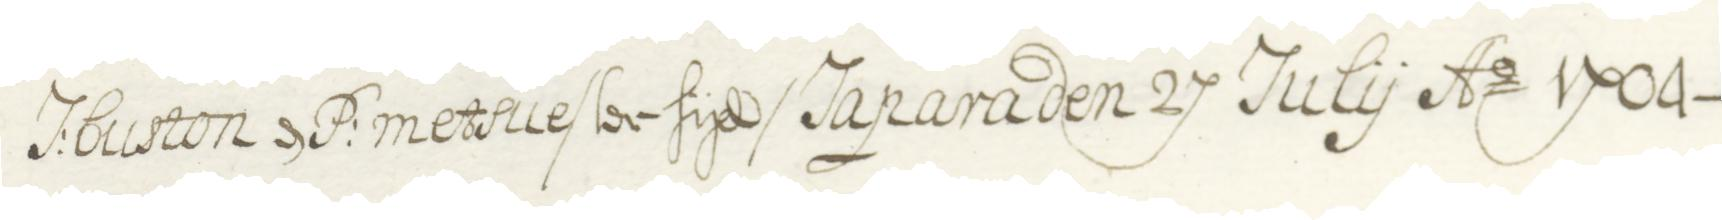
I: buston en P: metsue /ter sijde/ Japara den 27 Julij A=o 1704
